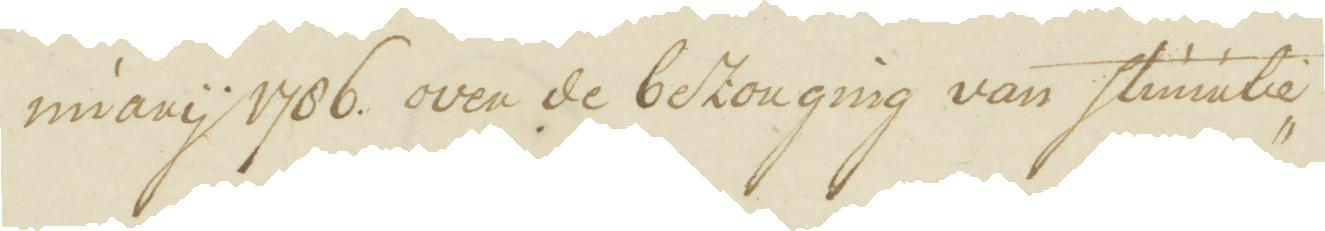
nuarij 1786. over de bezorging van stuurlie„
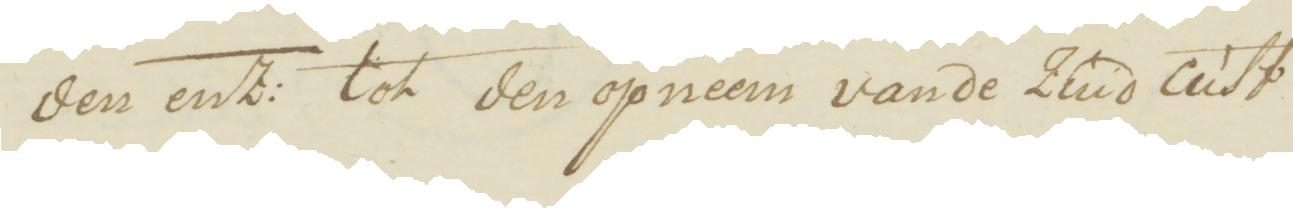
den enz: tot den opneem van de Zuid Cust
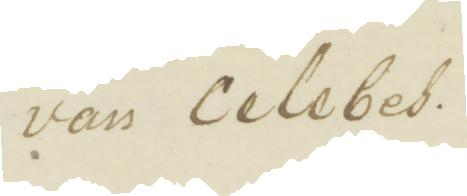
van Celebes.
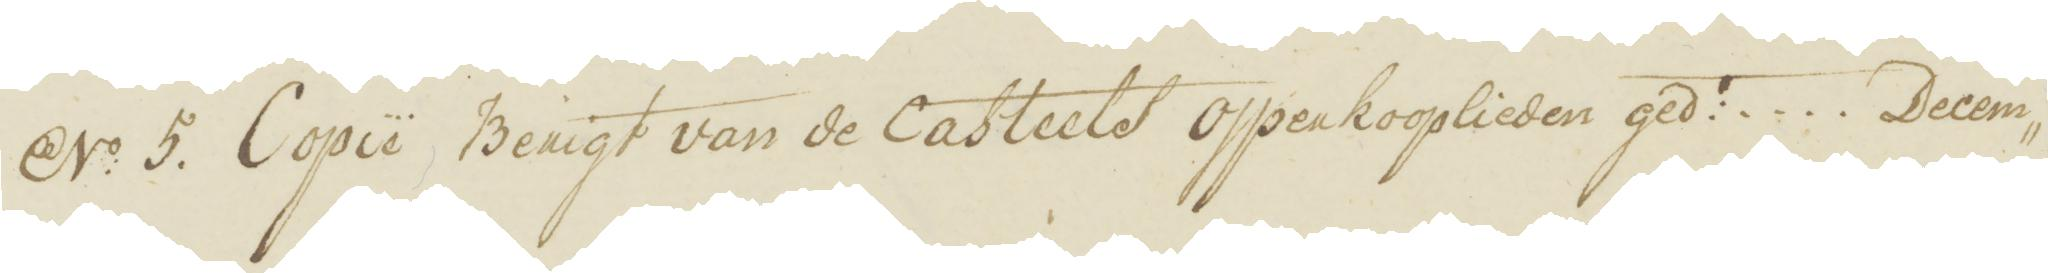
N:o 5. Copië Berigt van de Casteels opperkooplieden ged: .... Decem„
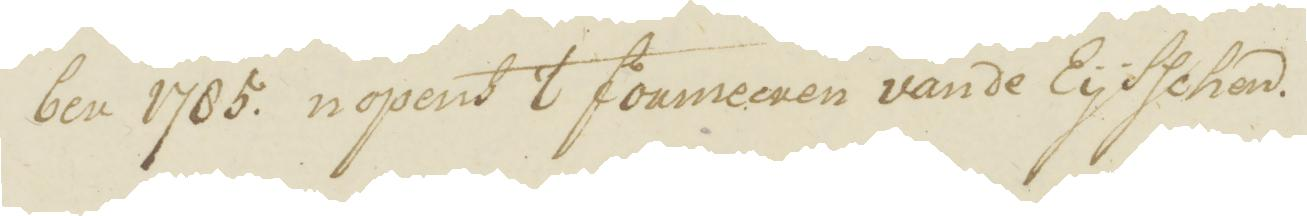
ber 1785. nopens ’t formeeren van de Eijsschen.
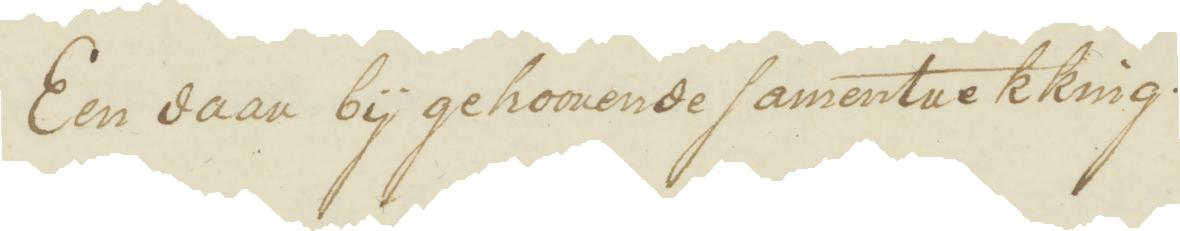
Een daar bij gehoorende samentrekking.
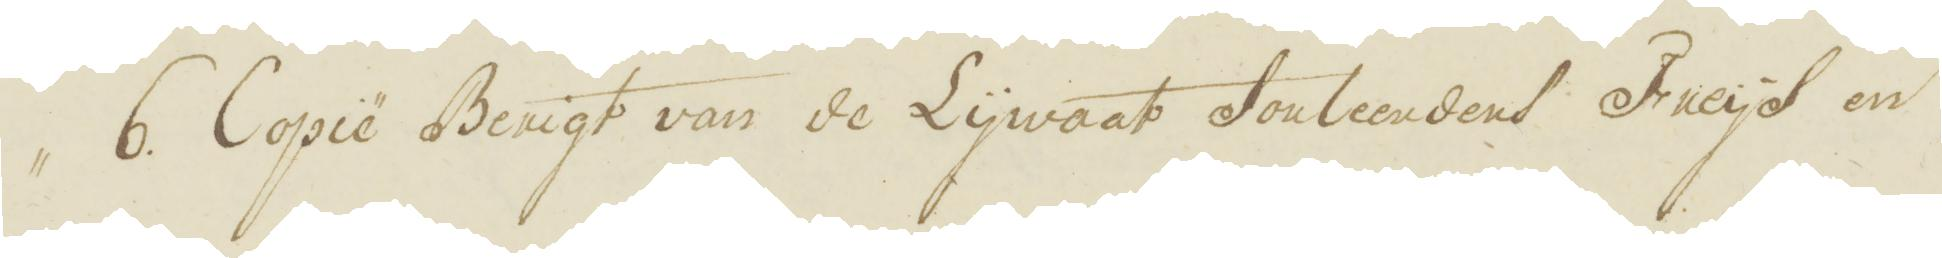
„ 6. Copië Berigt van de Lijwaat Sorteerders Freijs en
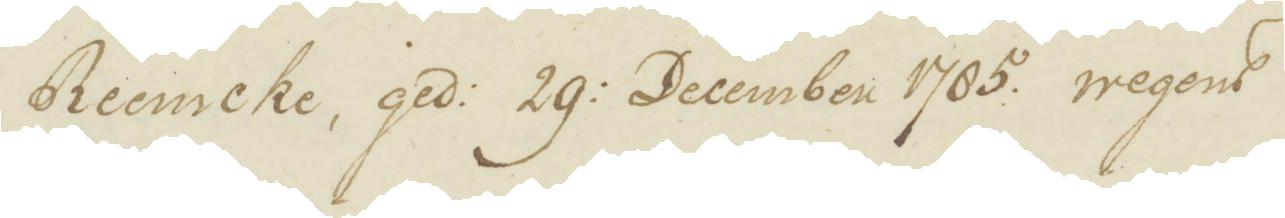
Reemcke, ged: 29: December 1785: wegens
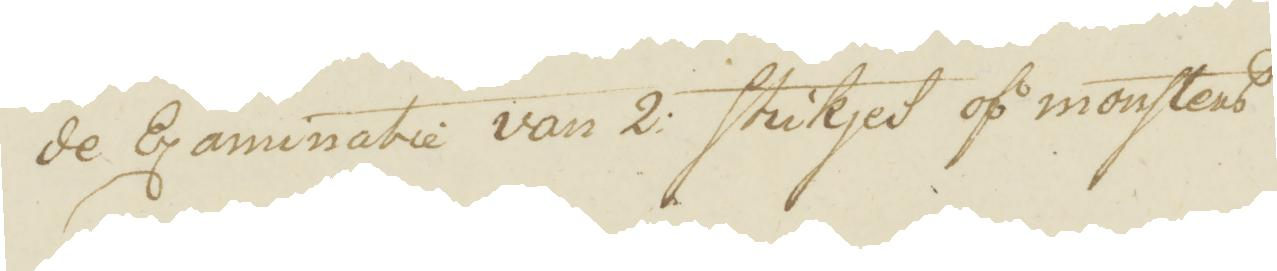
de Examinatie van 2: stukjes of monsters
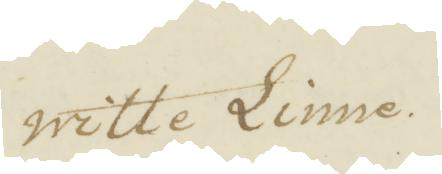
witte Linne.
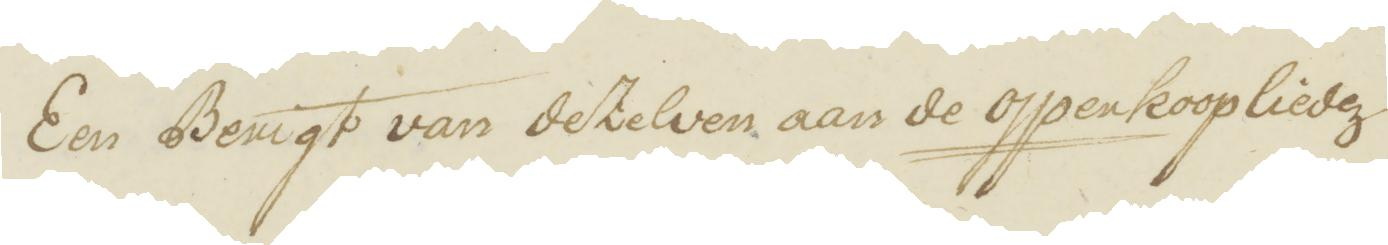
Een Berigt van bezelven aan de opperkooplieden
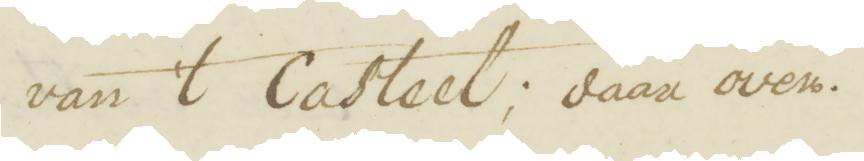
van ’t Casteel; daar over.
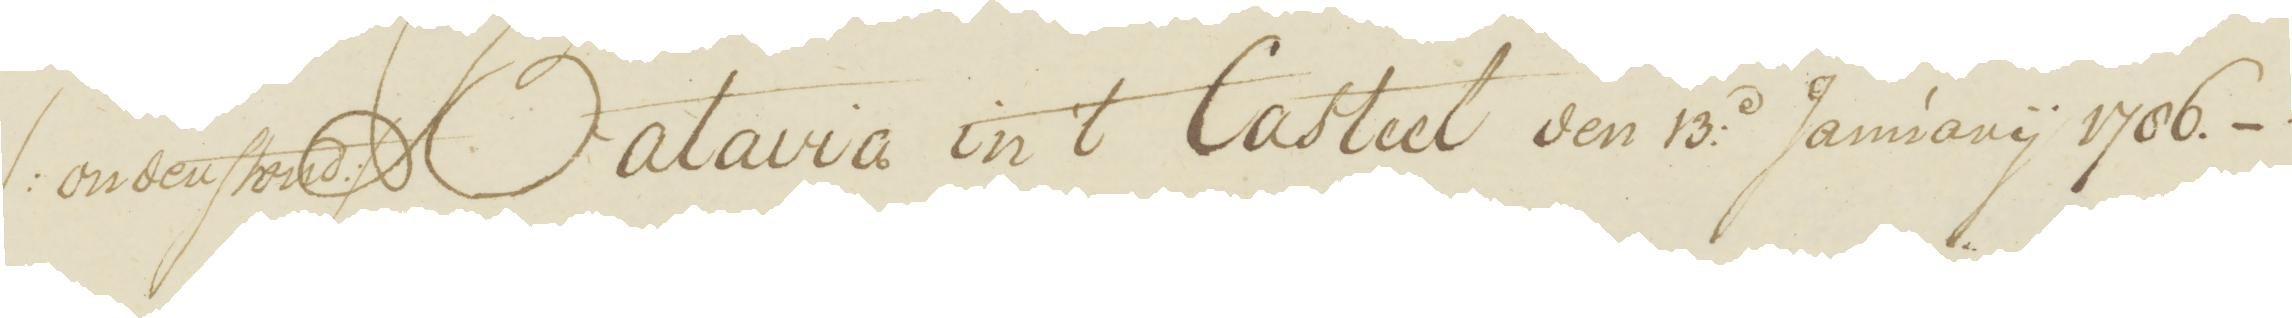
/:onderstond:/ Oatavia in ’t Casteel den 13:e Januarij 1786.–
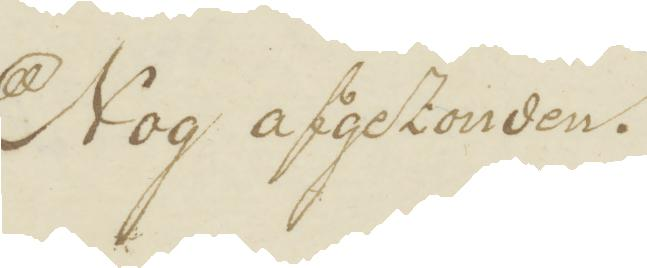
Nog afgezonden.
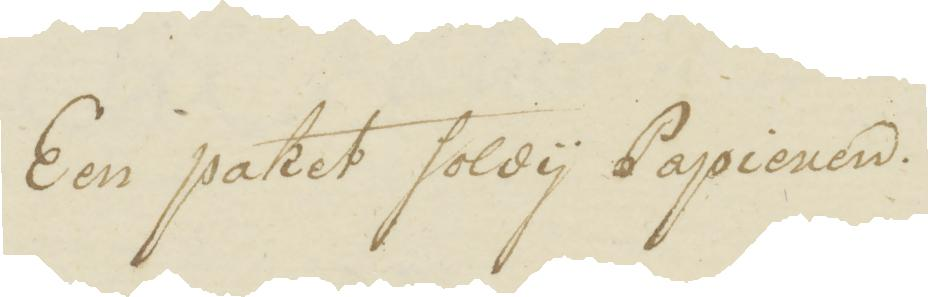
Een paket soldij Papieren.
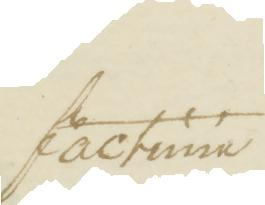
factuur
